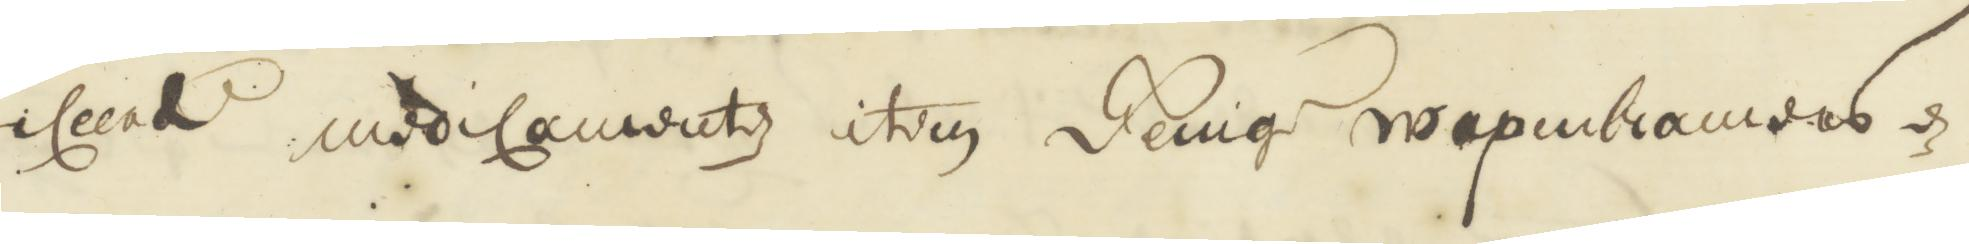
ficeerde medicamenten item Eenige wapenkamers en
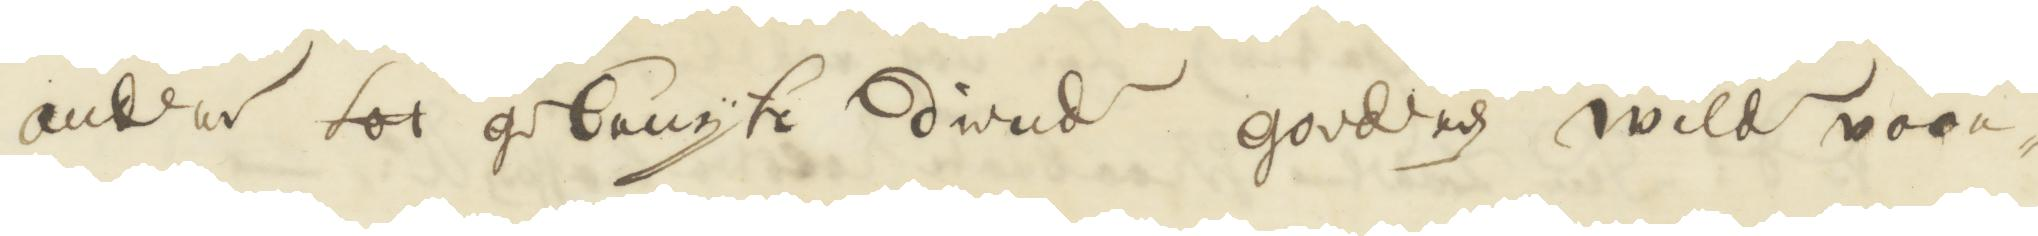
andere tot gebruijk diende goederen wilde voor
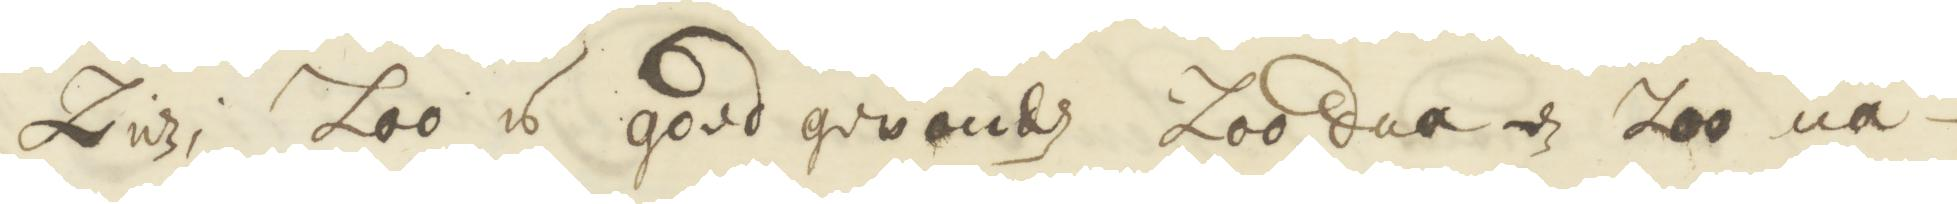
zien; zoo is goed gevonden zoodra en zoo na
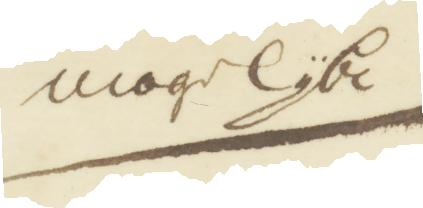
mogelijk
